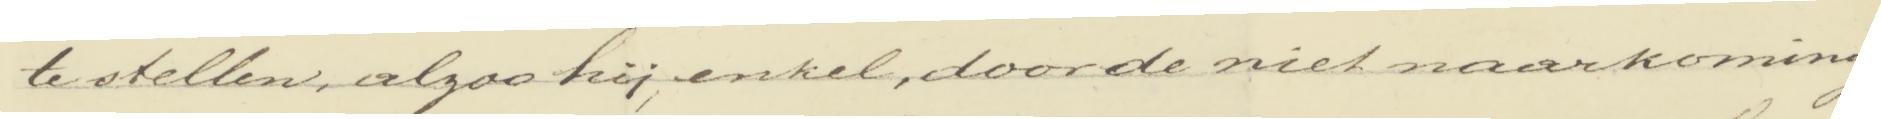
te stellen, alzoo hij enkel, door de niet naarkoming
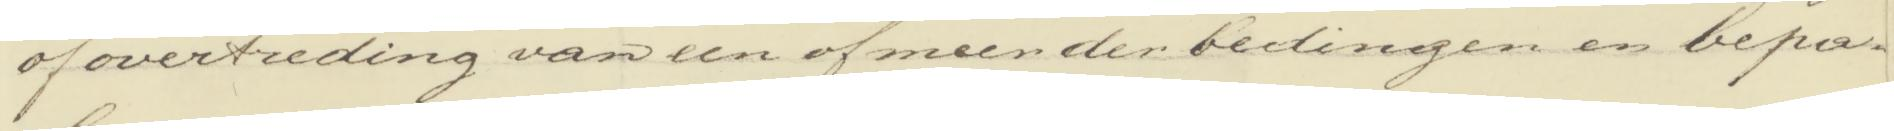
of overtreding van een of meer der bedingen en bepa=
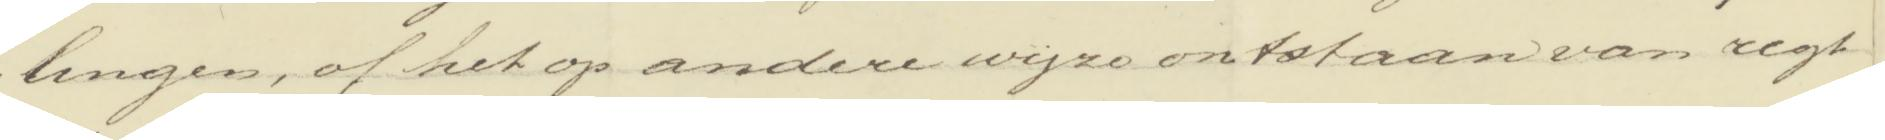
lingen, of het op andere wijzo ontstaan van regt
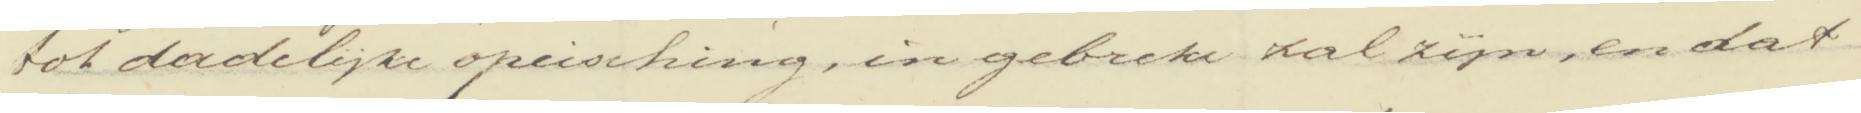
tot dadelijke opeisching, in gebreke zal zijn, en dat
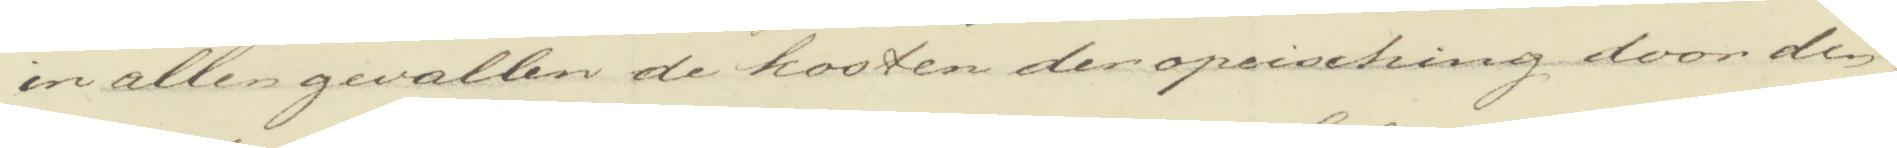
in allen gevallen de kosten der opeisching door den
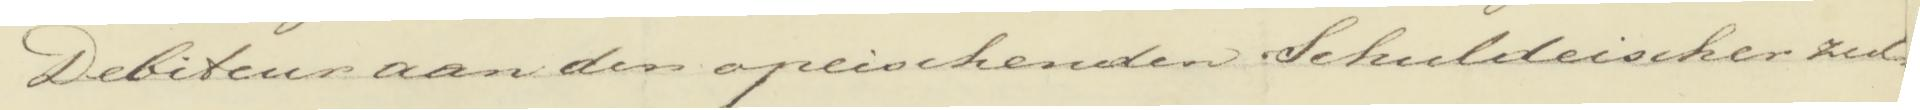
Debiteur aan den opeischenden Schuldeischer zul„
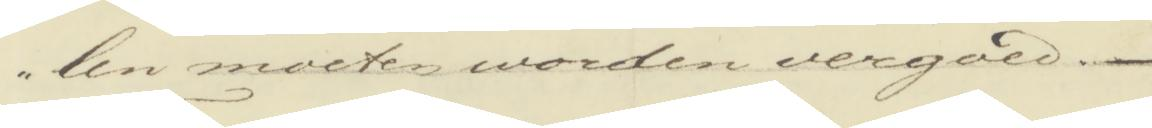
„len moeten worden vergoed.—
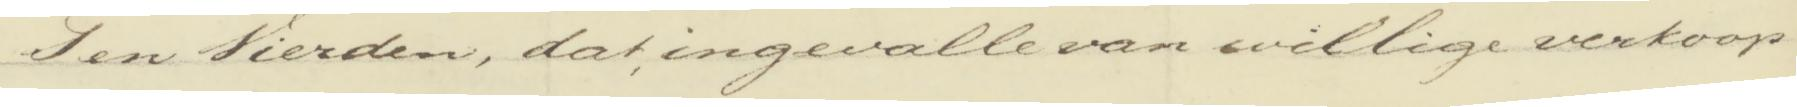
Ten Vierden, dat ingevalle van willige verkoop
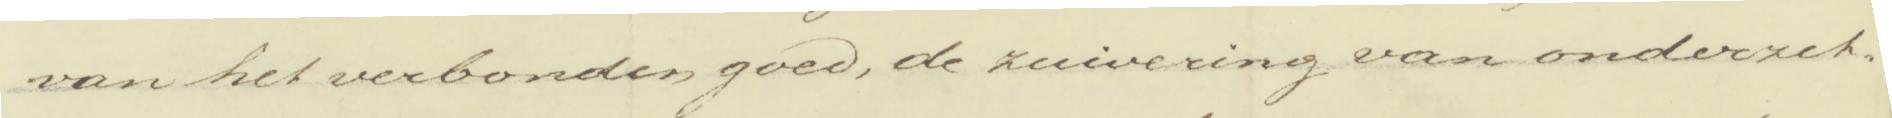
van het verbonden goed, de zuivering van onderzet„
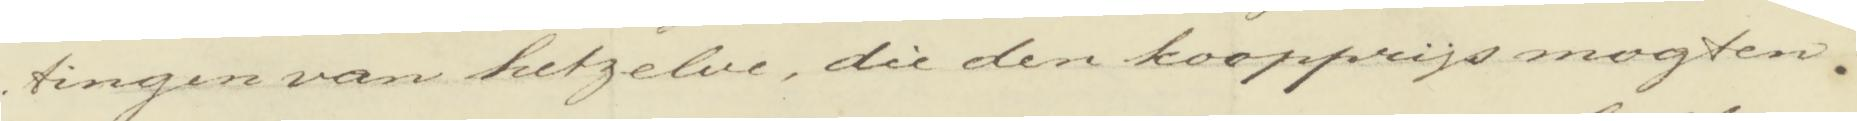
„tingen van hetzelve, die den koopprijs mogten
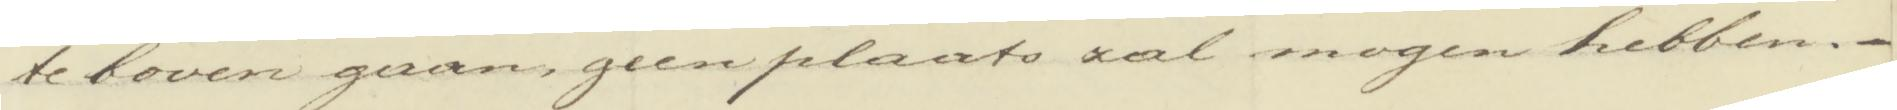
te boven gaan, geen plaats zal mogen hebben.-
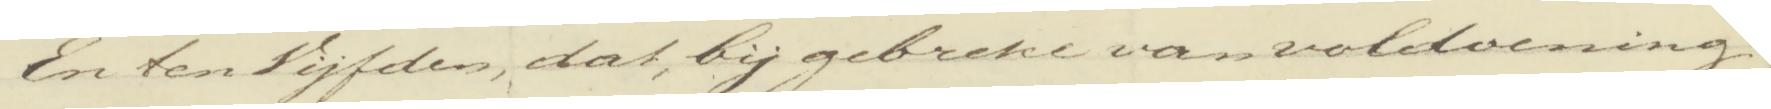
En ten Vijfden, dat bij gebreke van voldoening
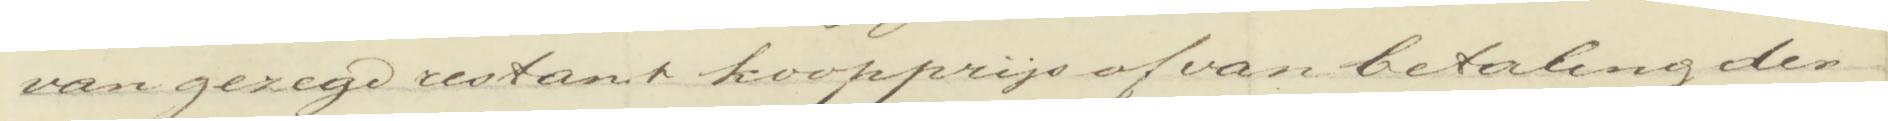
van gezegd restant koopprijs of van betaling der
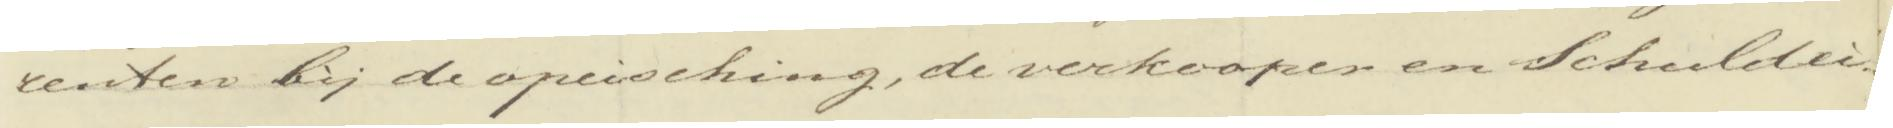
renten bij de opeisching, de verkooper en schuldei„
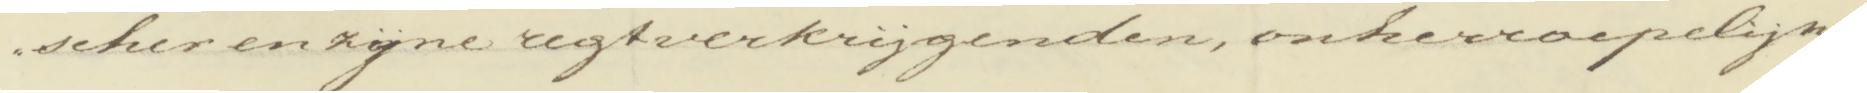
„scher en zijne regtverkrijgenden, onherroepelijk
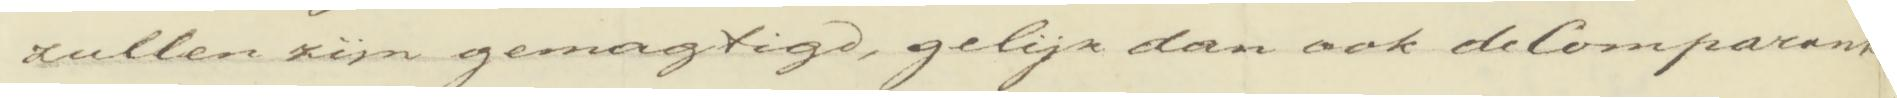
zullen zijn gemagtigd, gelijk dan ook de Comparant
